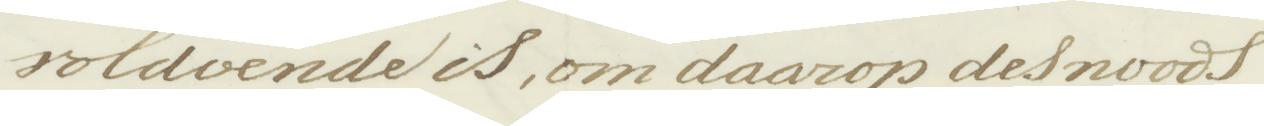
voldoende is, om daarop desnoods
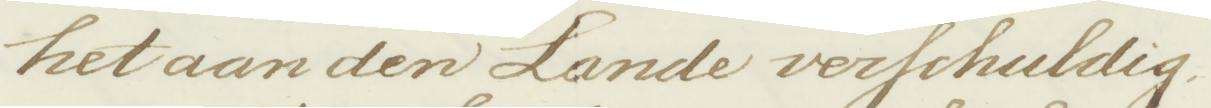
het aan den Lande verschuldig,
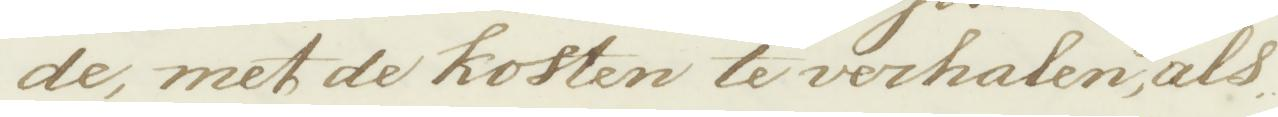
de, met de kosten te verhalen, als,
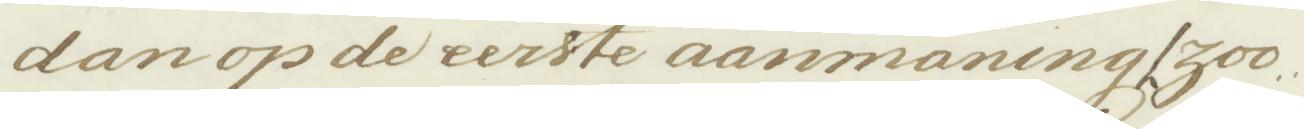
dan op de eerste aanmaning zoo,
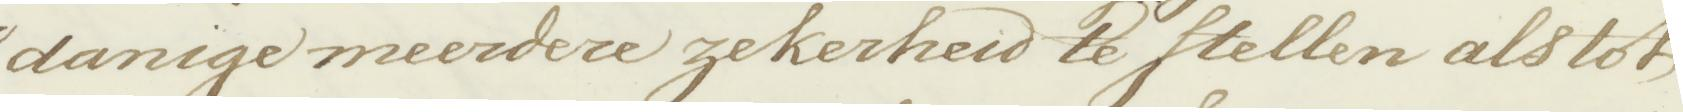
danige meerdere zekerheid te stellen als tot
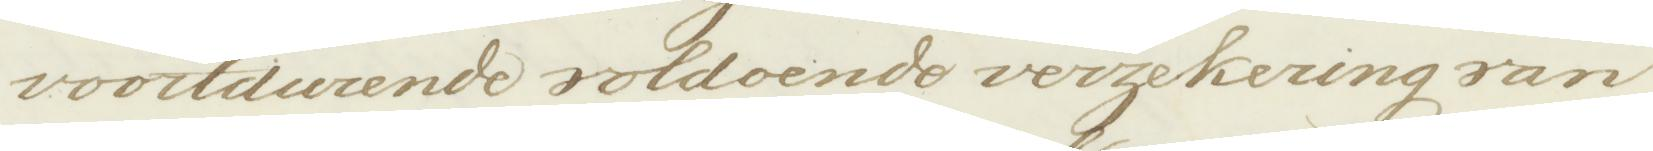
voortdurende voldoende verzekering van
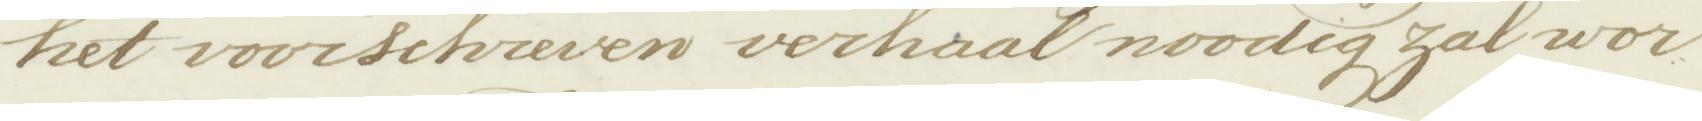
het voorschreven verhaal noodig zal wor„
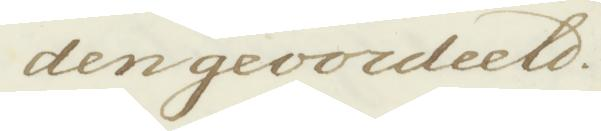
den geoordeeld.
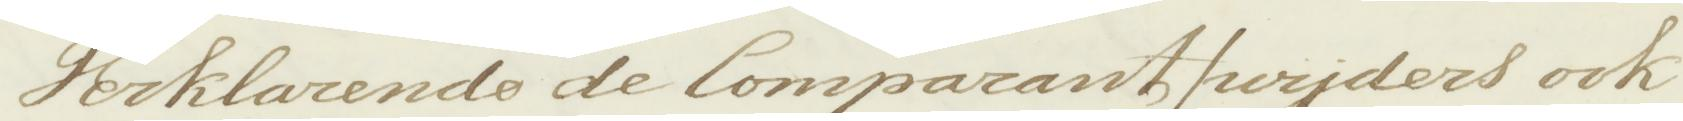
Verklarende de Comparant wijders ook
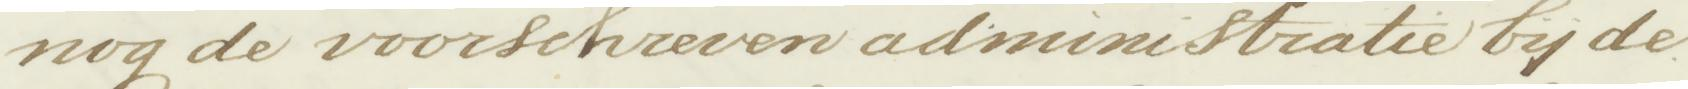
nog de voorschreven administratie bij de.
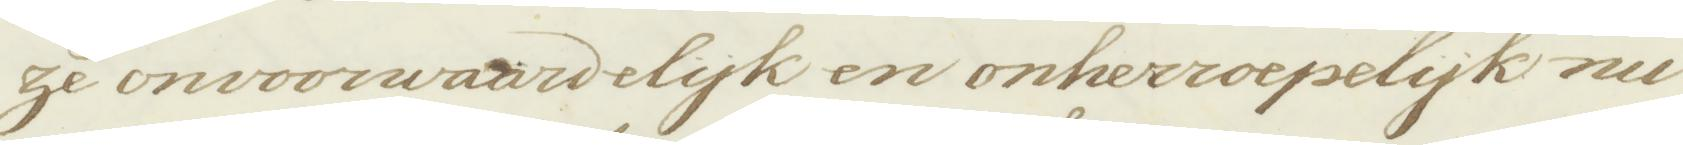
ze onvoorwaardelijk en onherroepelijk nu
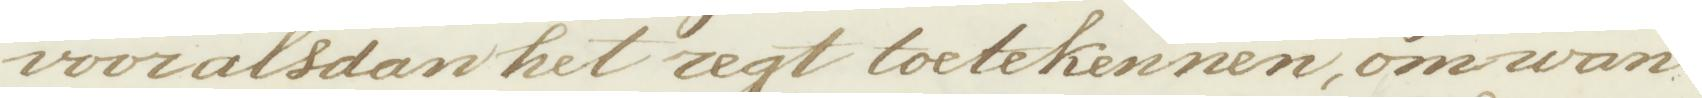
voor als dan het regt toetekennen, om wan.
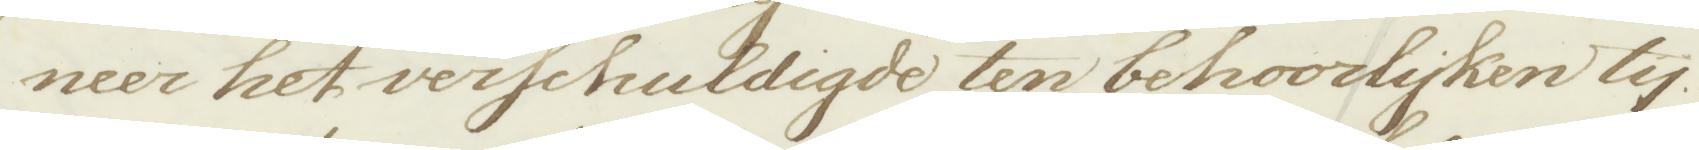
neer het verschuldigde ten behoorlijken tij.
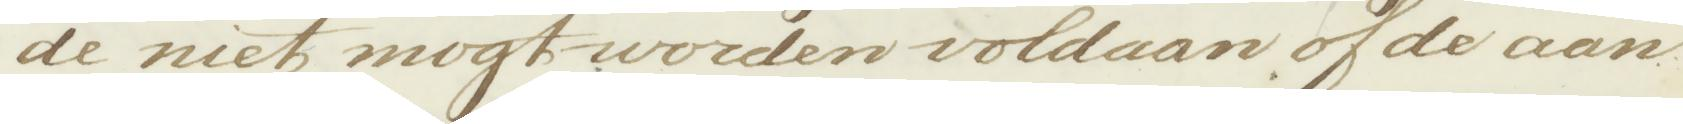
de niet mogt worden voldaan, of de aan
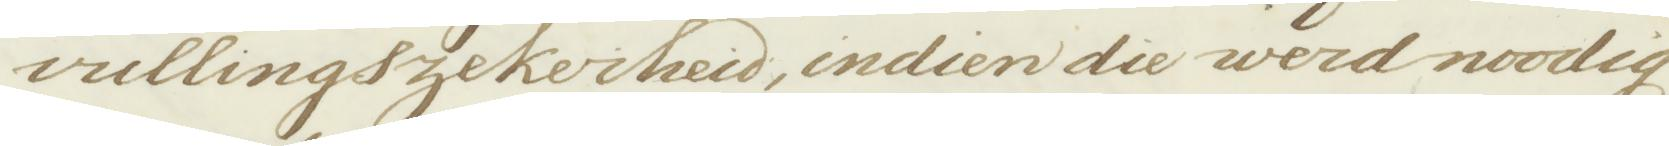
vullingszekerheid, indien die werd noodig
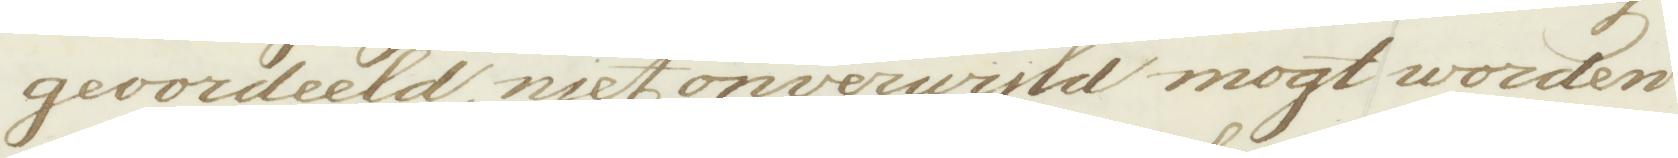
geoordeeld, niet onverwijld mogt worden
